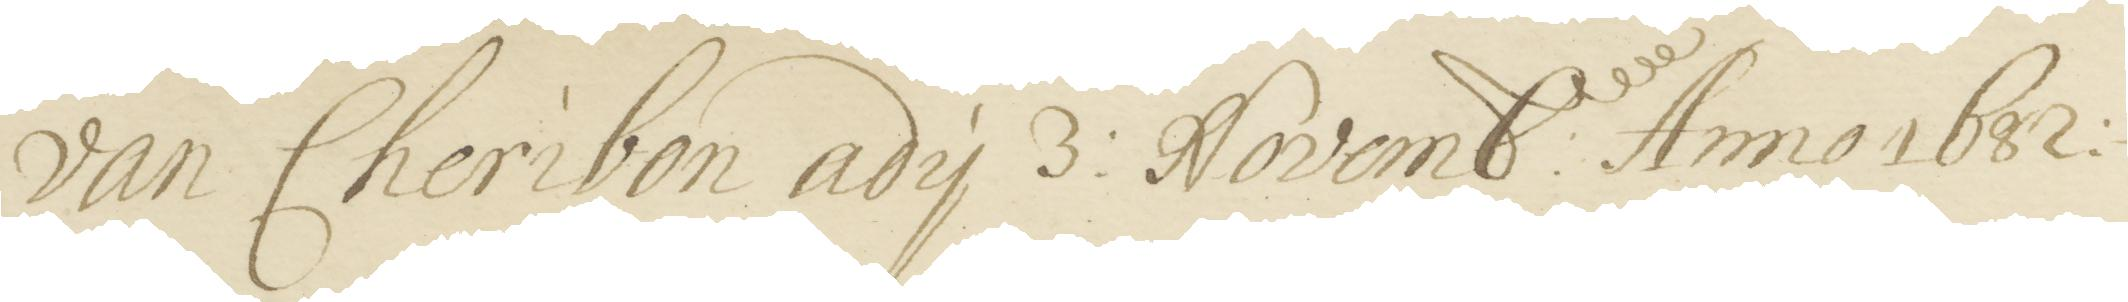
Van Cheribon adij 3: Novemb: Anno 1682:
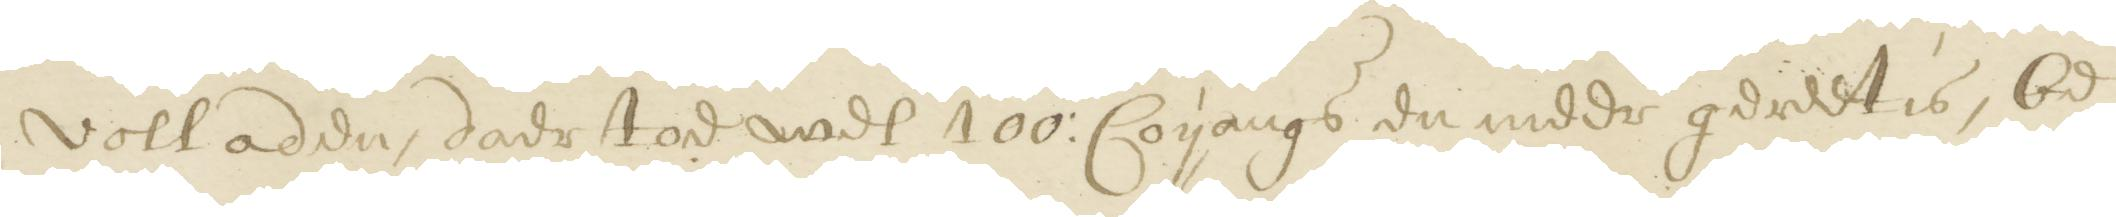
volladen, daer toe wel 100: Coijangs en meer gereet is, be
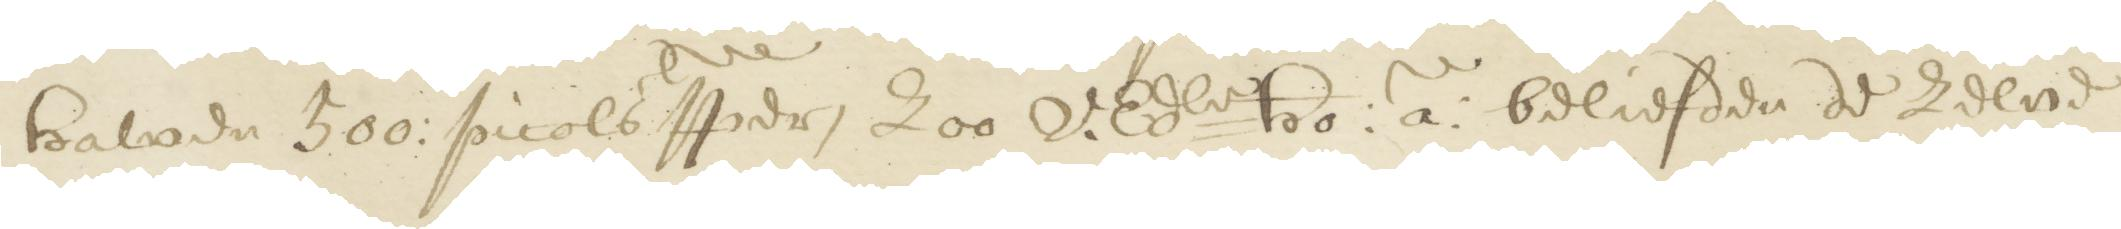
halven 500: picols peper, zoo V.Ed=le ho: a: beliefden de Zelve
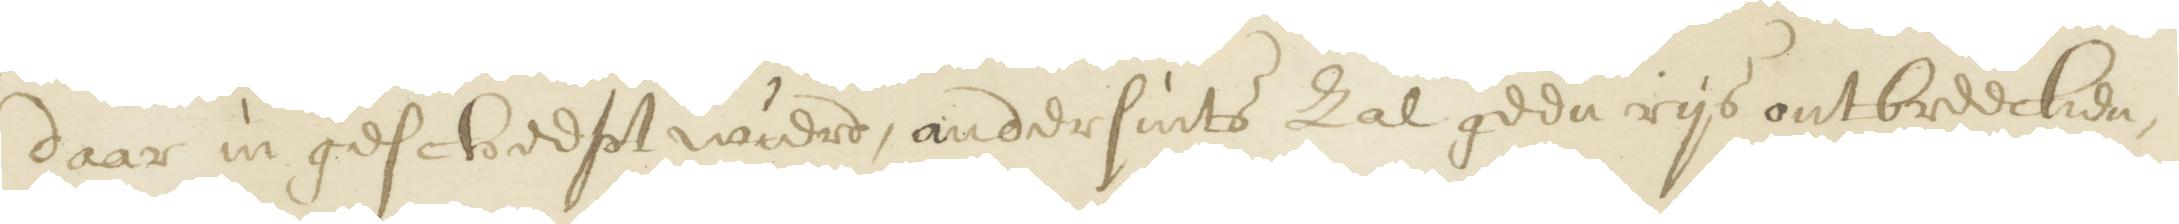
daar in gescheept wierd, andersints Zal geen rijs ontbreecken,
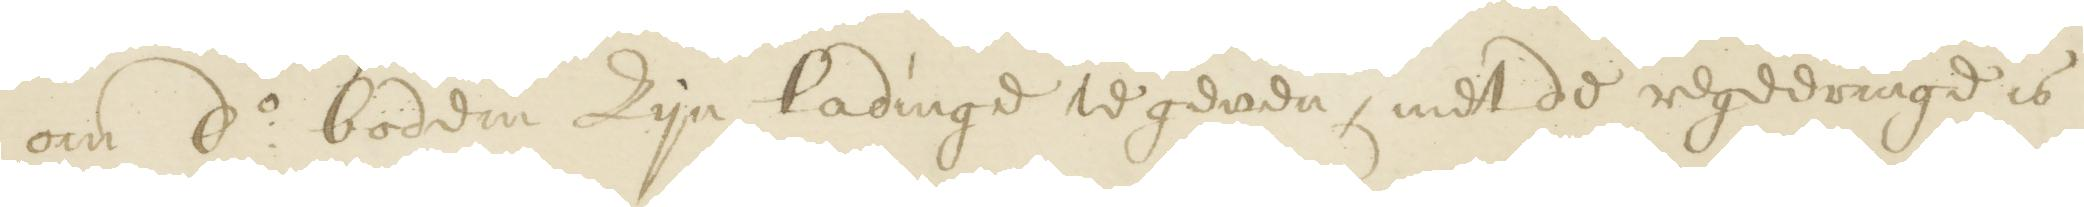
om d:o bodem Zijn ladinge te geven, met de regeeringe is
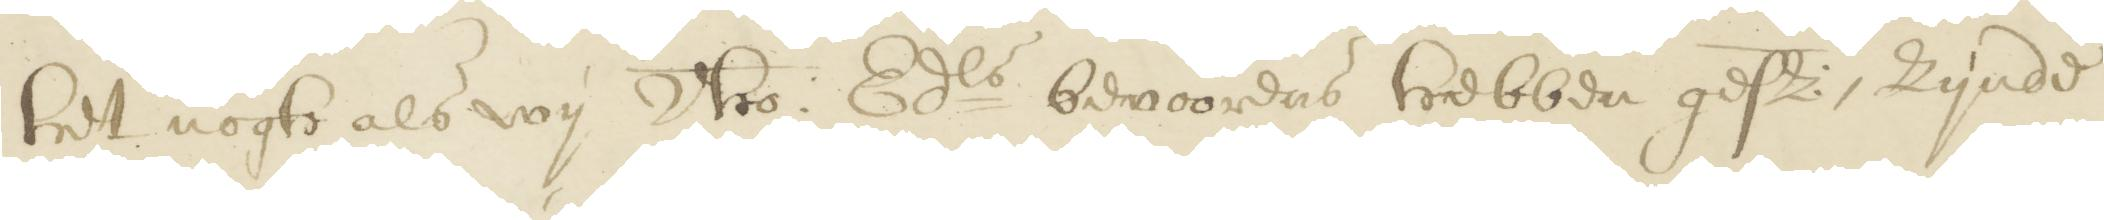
het nogh als wij Vho: Ed=ls bevoorens hebben gesz:, Zijnde
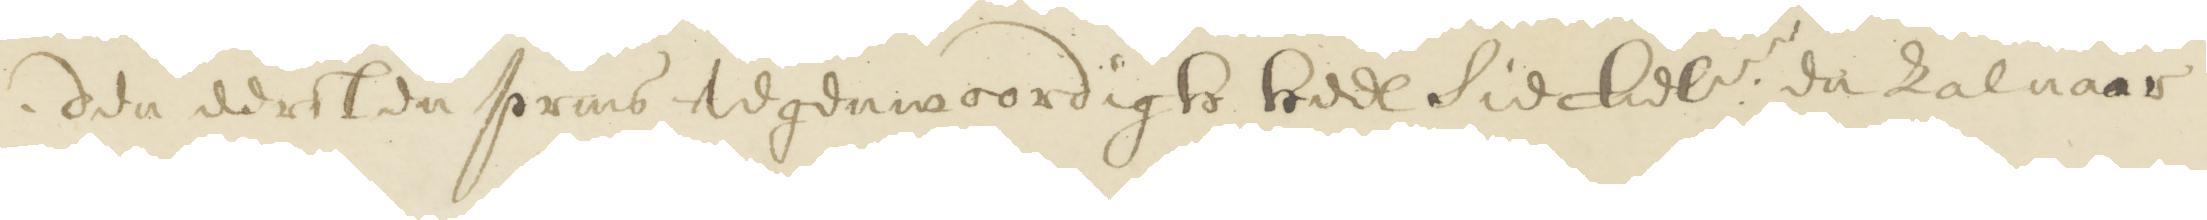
den eersten prins tegenwoordigh heel Sieckelijk en Zal naar
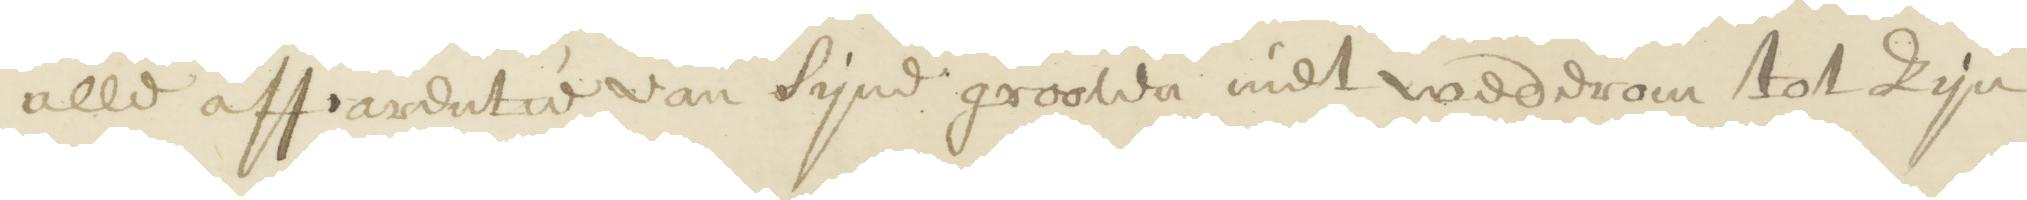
alle apprarentie van Sijne grooten niet wederom tot Zijn
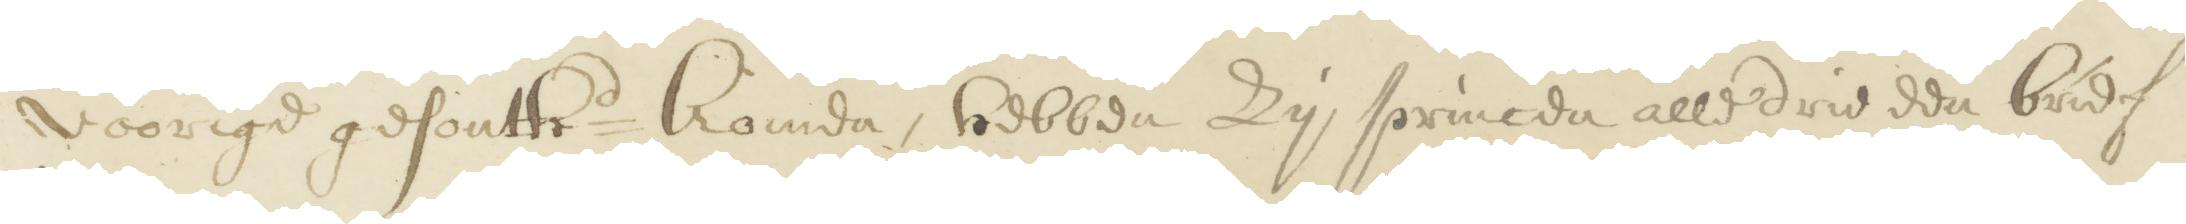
voorige gesonth=d komen, hebben zij princen alle drie een brief
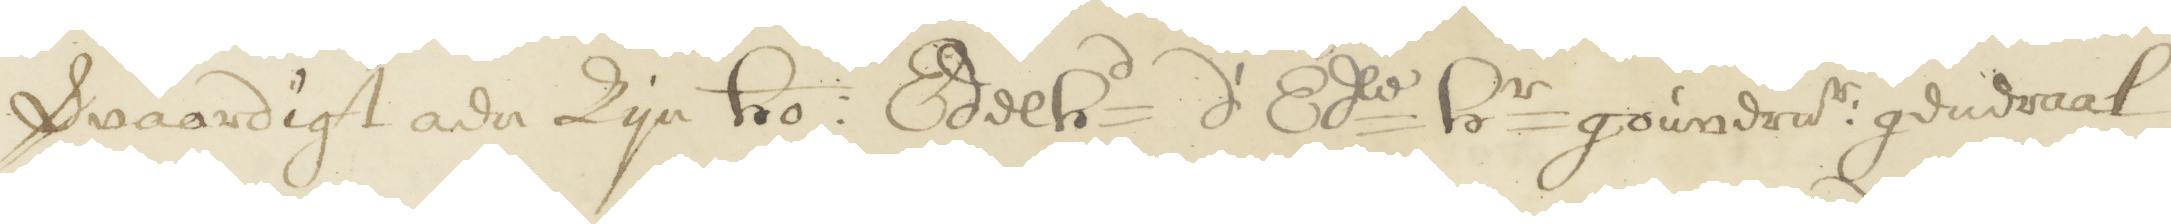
vervaardigt aen Zijn ho: Edelh=d d’ Ed=le h=r gouvern:r generaal
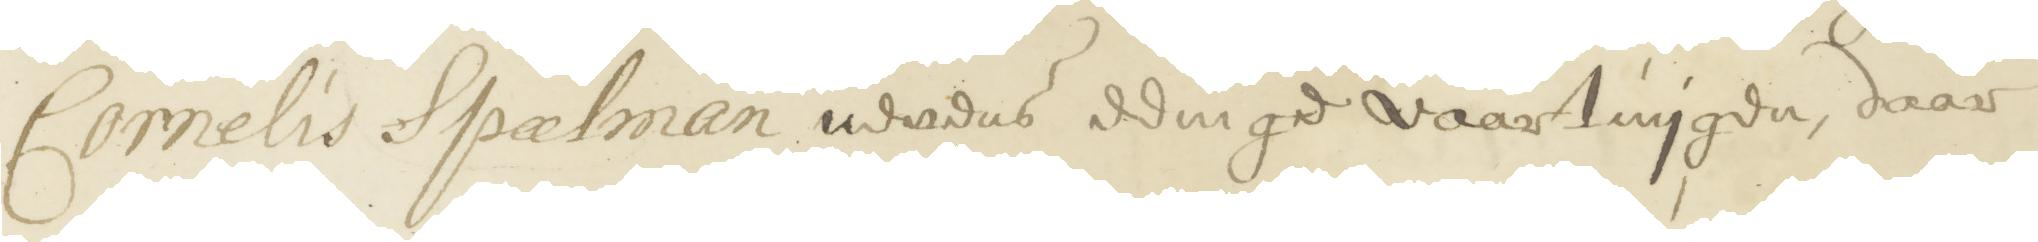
Cornelis Speelman, nevens eenige vaartuijgen, daar
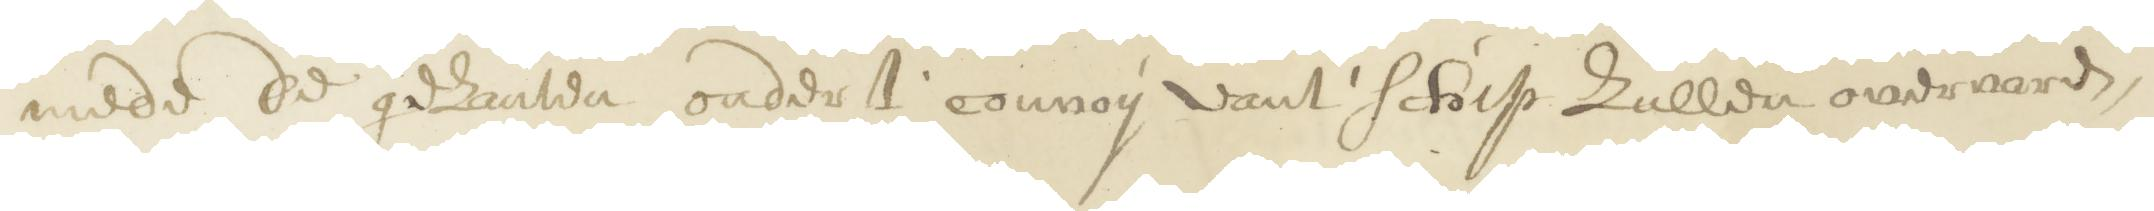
mede de gezanten onder t' convoij vant' Schip Zullen overvaren,
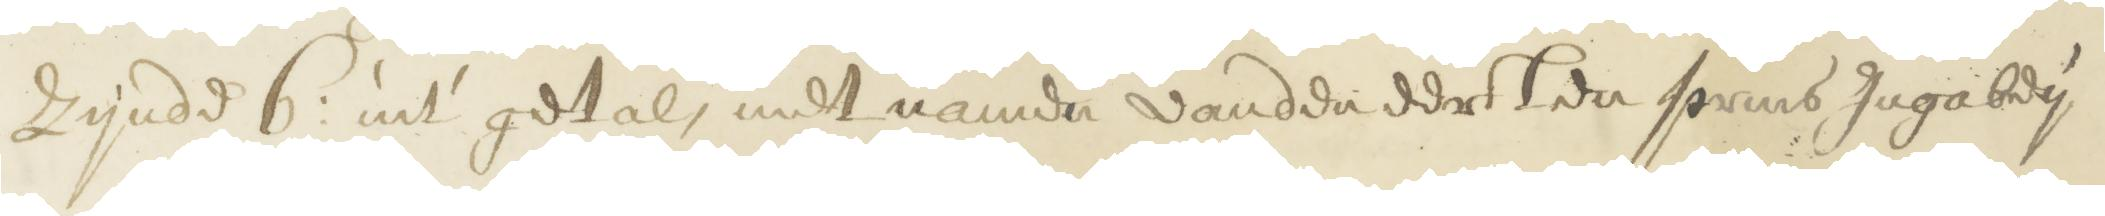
Zijnde 6: int' getal, met namen van den eerst en prins Jngabeij
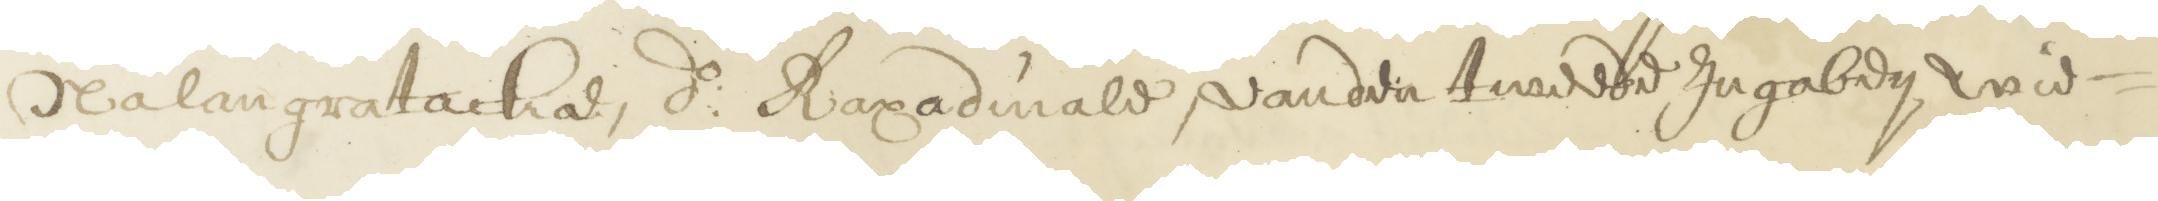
Nalangratacke, d:o Kaxadurale, van den tweede Ingabeij wie=
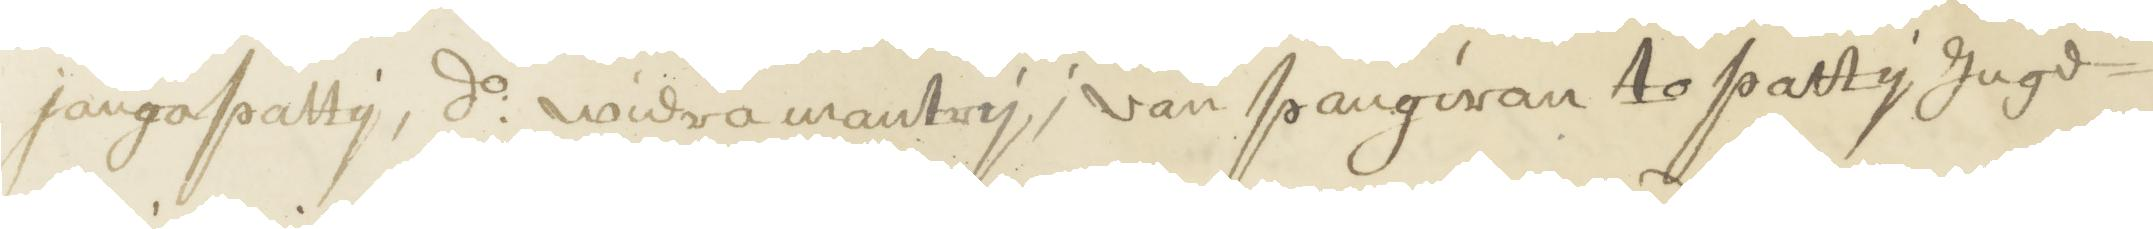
jangapattij, d:o wiera mantrij; van pangiran to pattij Inge=
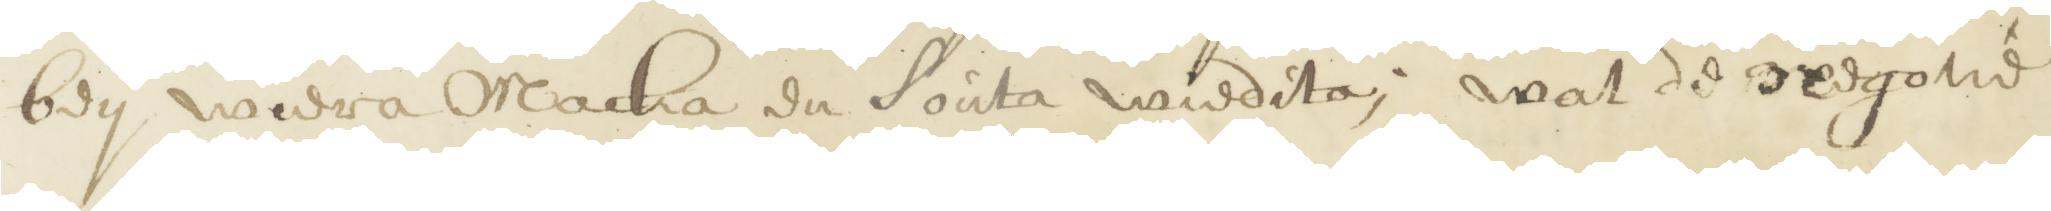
beij wiera Macka en Souta wiedita; wat de Negotie
